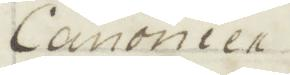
Canonier
